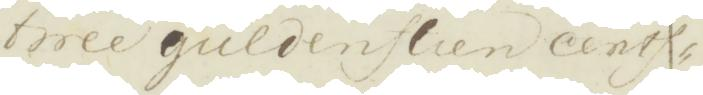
twee guldens tien cents„
